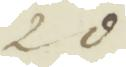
2 d
